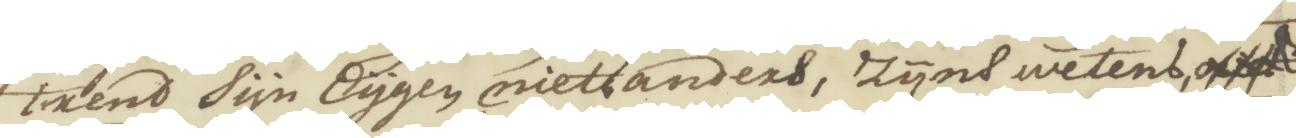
trend sijn Eijgen niet anders, zijns wetens,
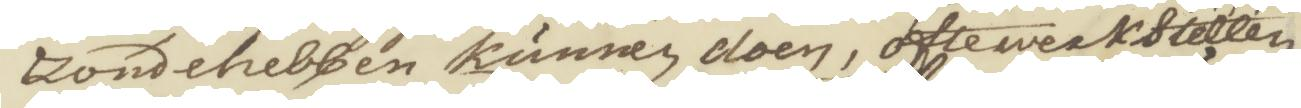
zoudehebben kunnen doen, ofte werkstellen
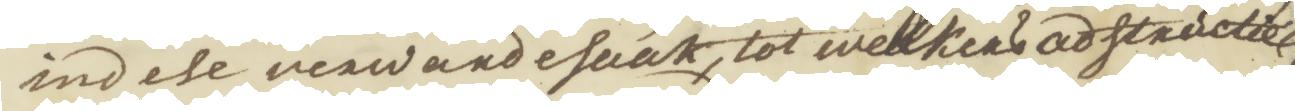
indese verwarde saak, tot welkers adstructie
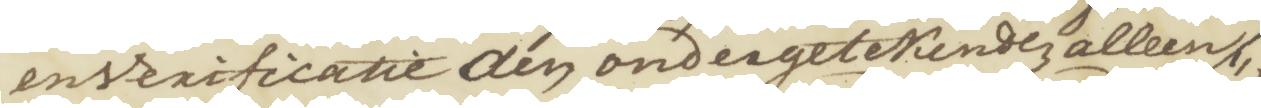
en verificatie den ondergetekenden alleen„
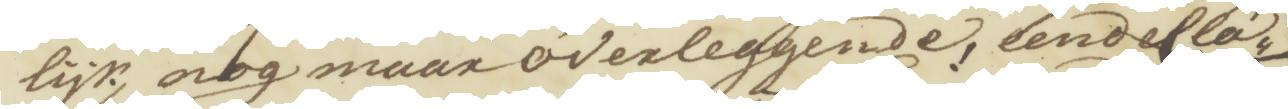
lijk, nog maar overleggende, eende Cla„
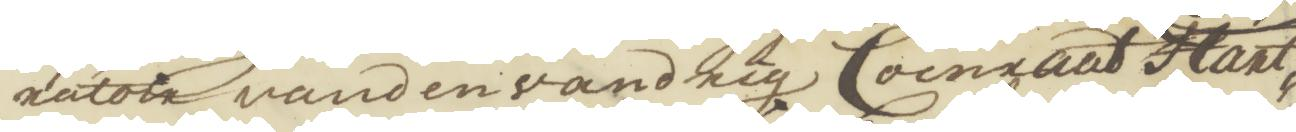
ratoir vanden vandrig Coinraat Hart
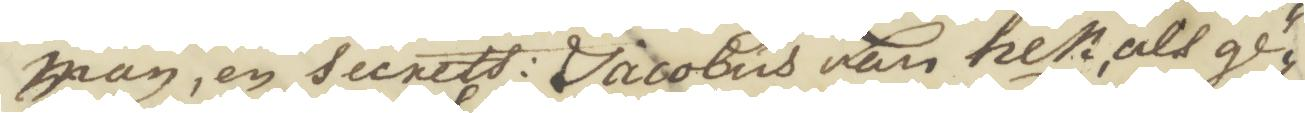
man, en secrets: Jacobus van hek, als ge„
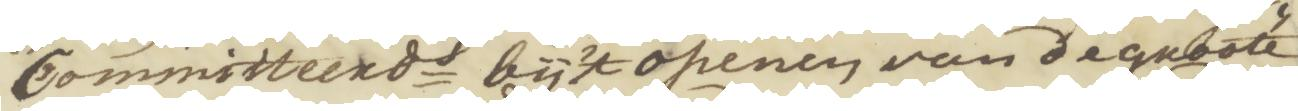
Committeerd=s bij ’t openen van de groote
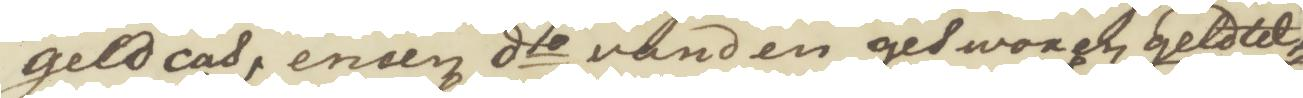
geldcas, en een d=o van den gesworen geldtel„
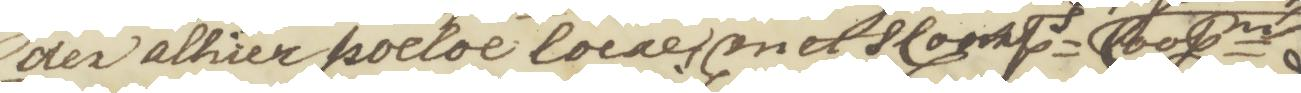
der alhier poeloe loere, met ’sComp=s Coop=m
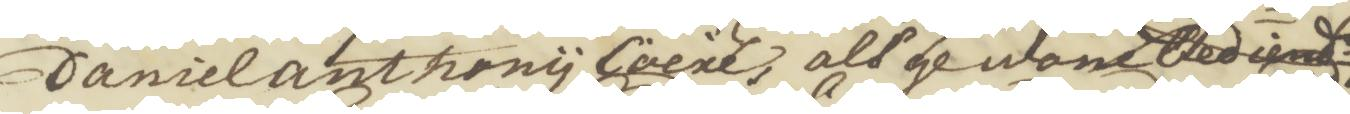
daniel anthonij coert, als gewone bediend=s
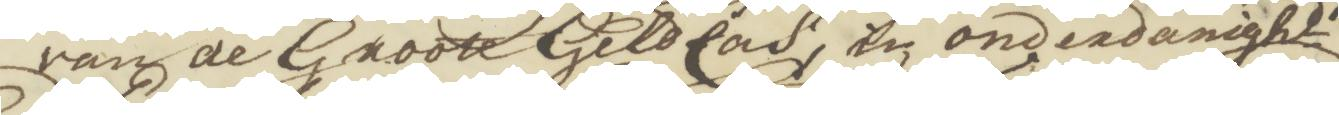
van de Groote Geld Cas, in onderdanigh=
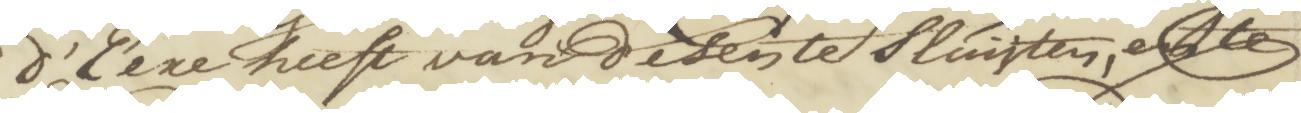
d’ Eere heeft van desen te sluijten, en te
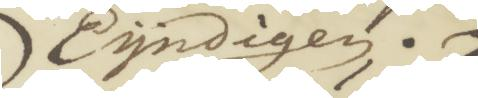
Eijndigen.
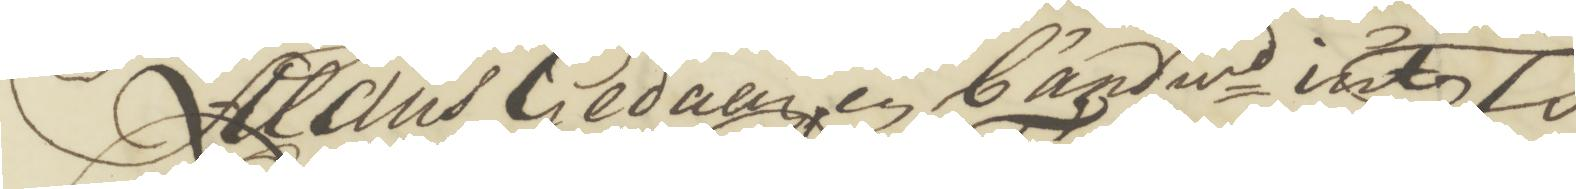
Aldus Gedaen, en b'andw=d int
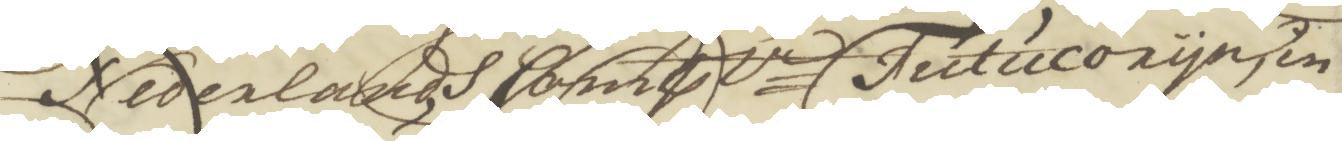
Nederlands Compt=r Tutucorijn, in
